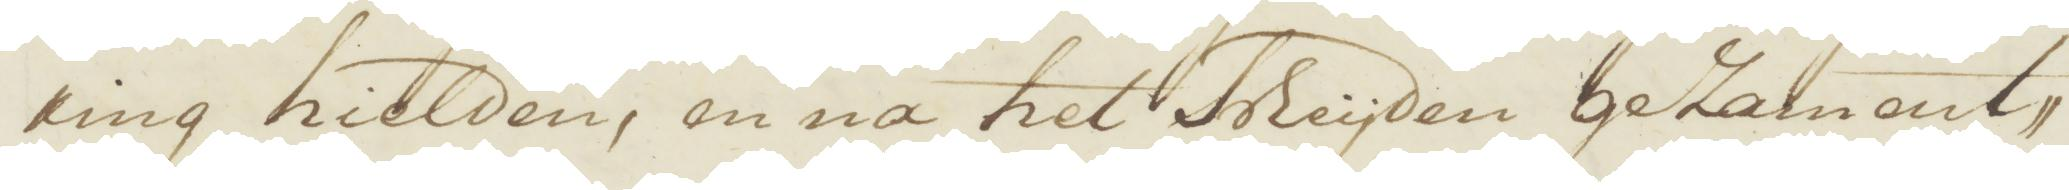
ring hielden, en na het scheijden gezament„
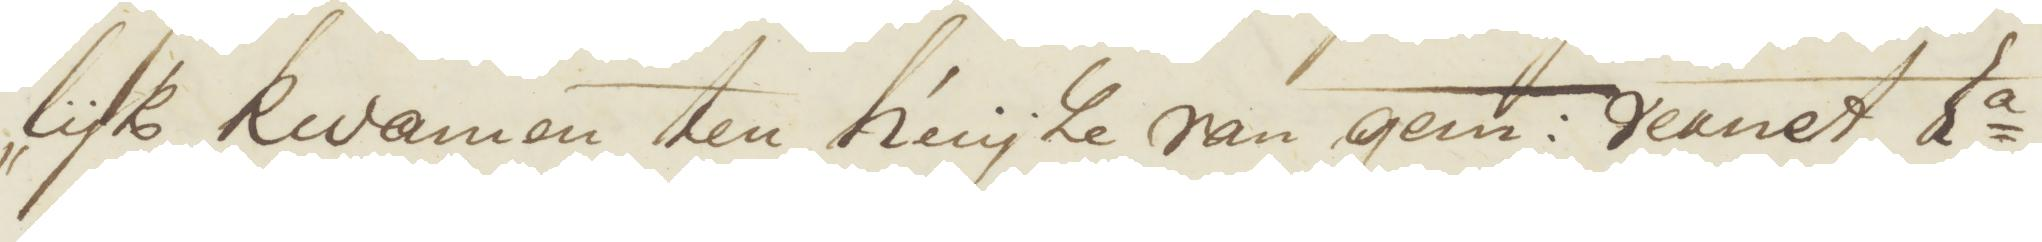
„lijk kwamen ten huijze van gem: vernet &=a
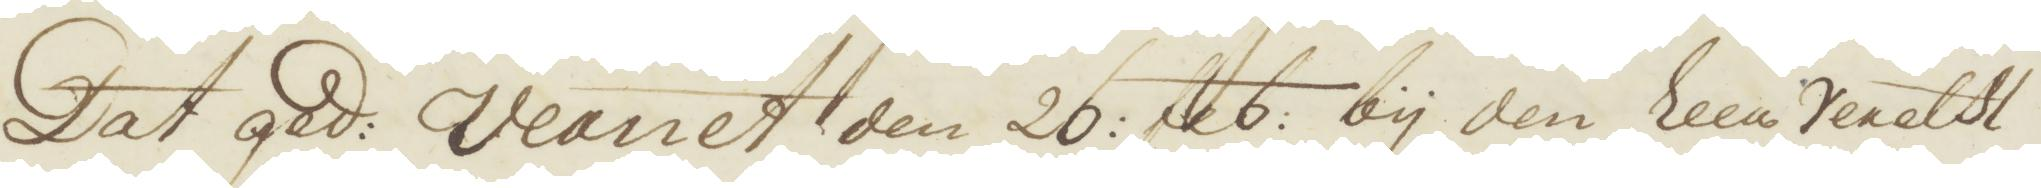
Dat ged: Vernet den 26: feb: bij den heer verelst
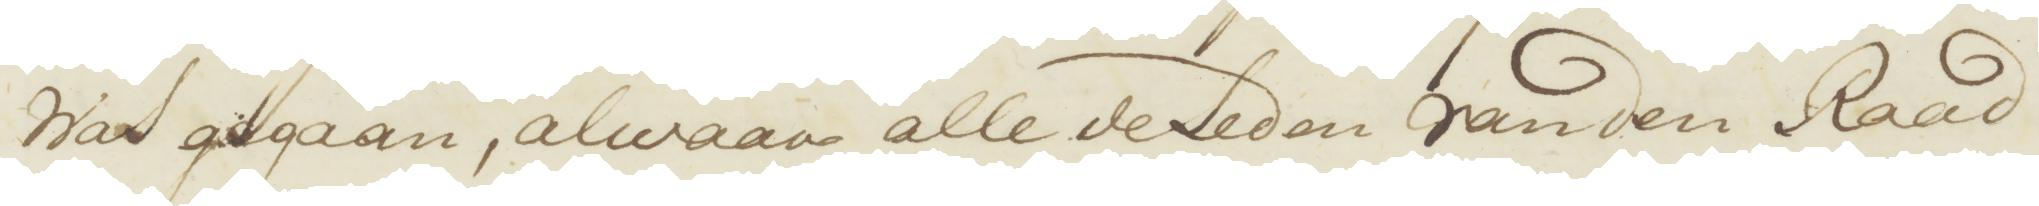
was gegaan, alwaar alle de Leden van den Raad
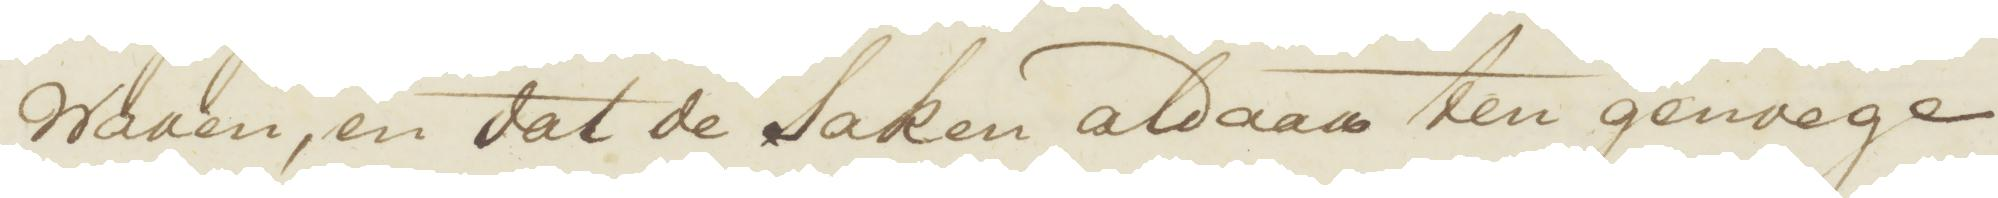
waaren, en dat de saken aldaar ten genoege
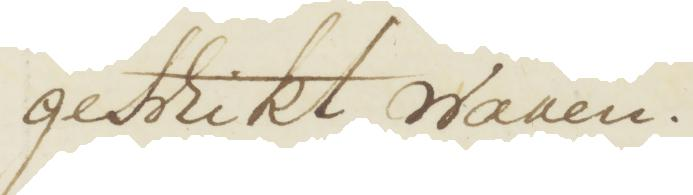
geschikt waren.
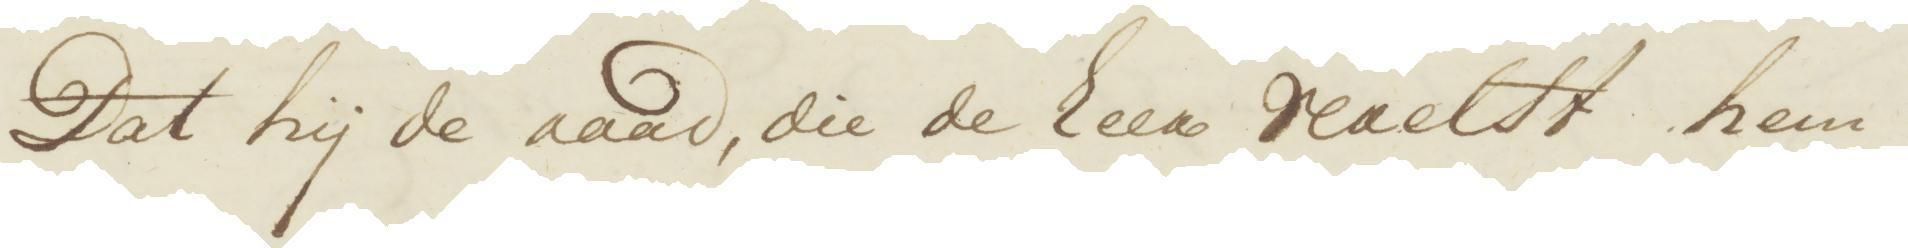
Dat hij de raad, die de heer verelst hem
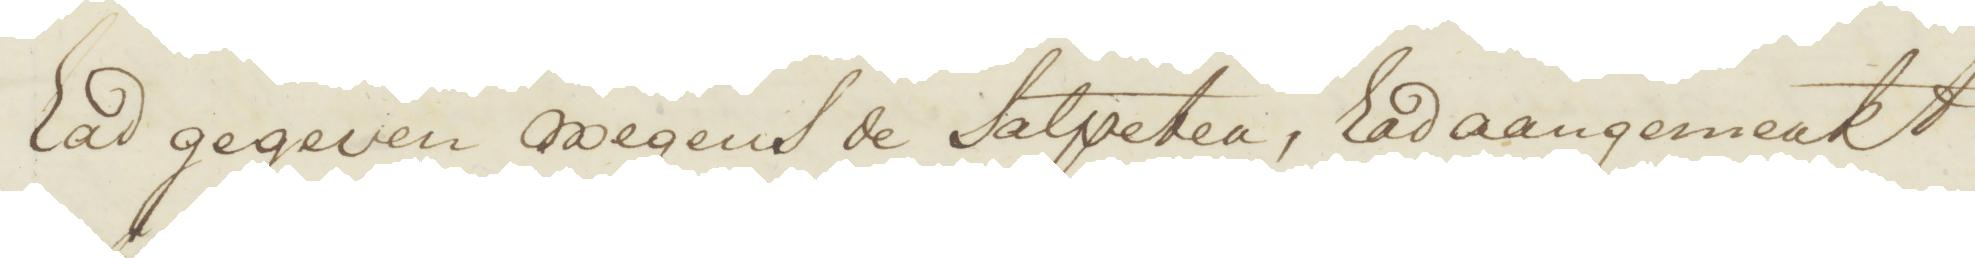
had gegeven wegens de salpeter, had aangemerkt
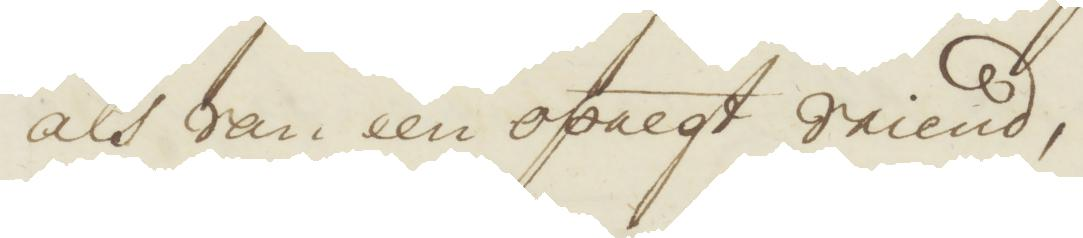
als van een opregt vriend,
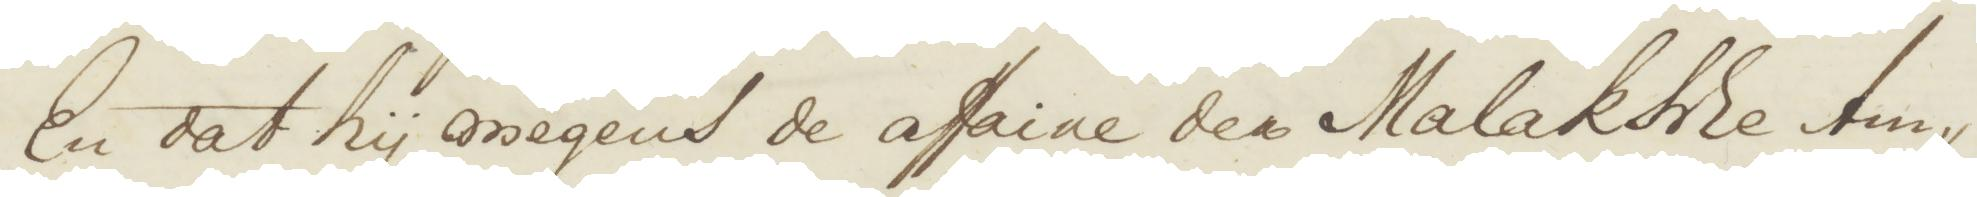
En dat hij wegens de affaire der Malaksche Am„
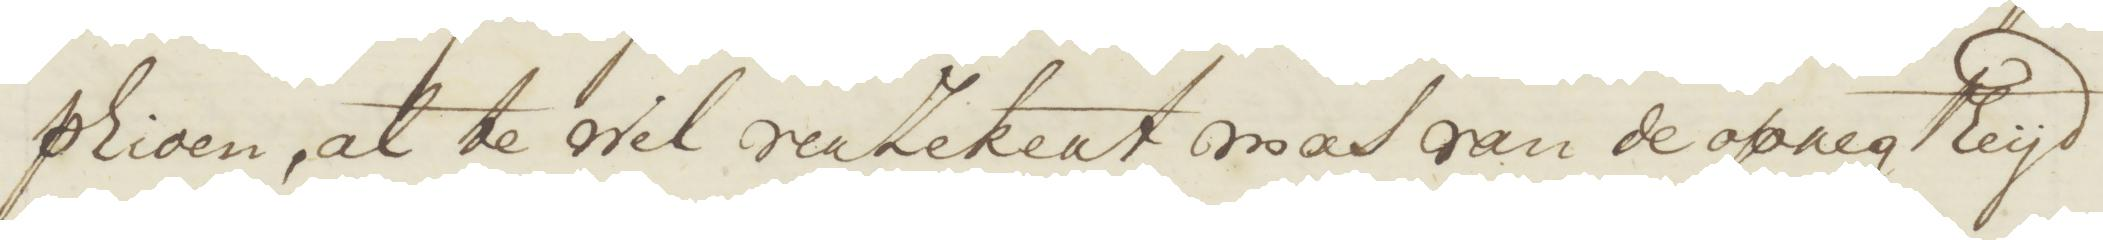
phioen, al te wel verzekert was van de opregtheijd
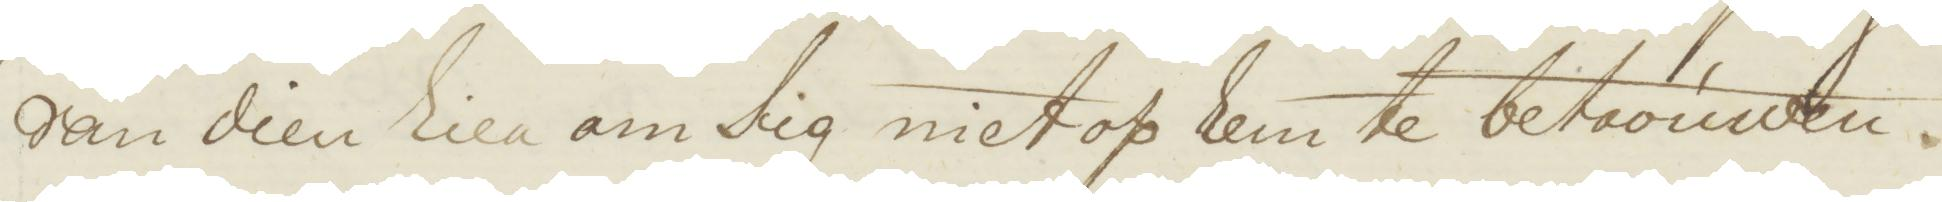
van dien hier om sig niet op hem te betrouwen.
